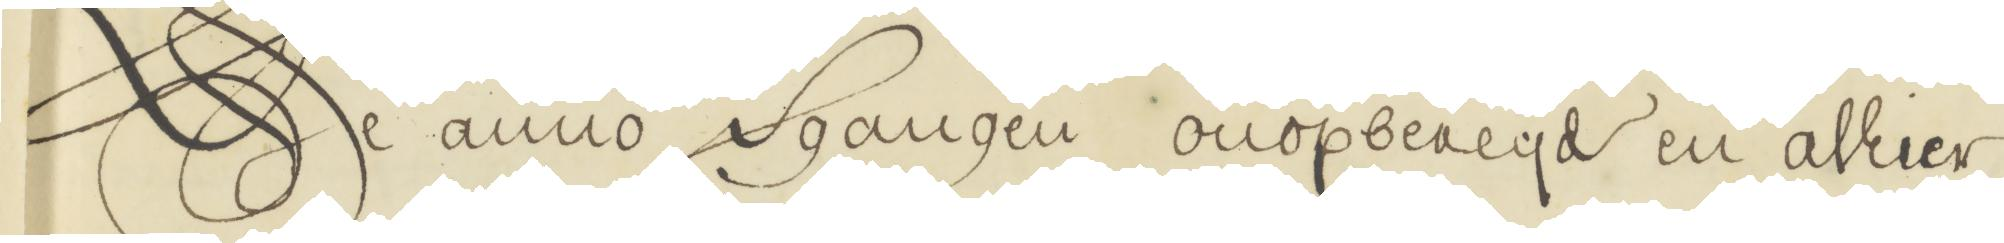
De anno vergangen onop bereijde en alhier
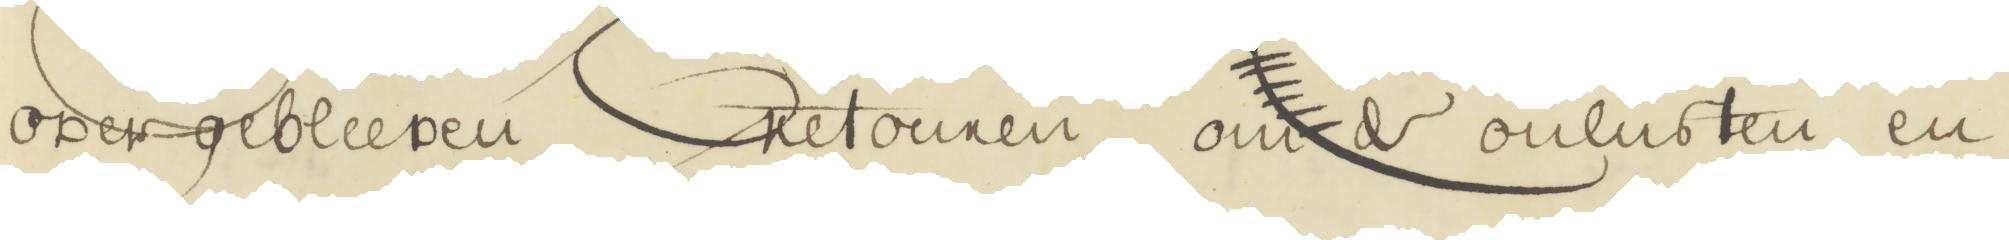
overgebleeven retouren om de onlusten en
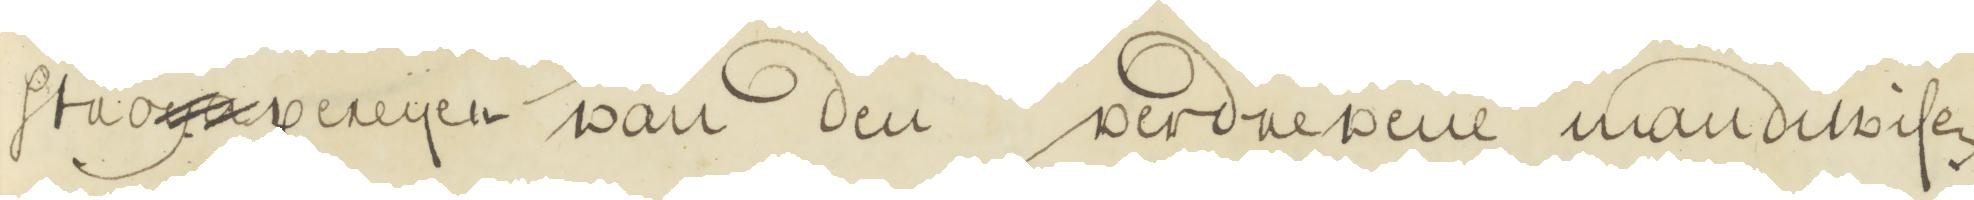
strogapereijen van den verdrevene mandiwisen
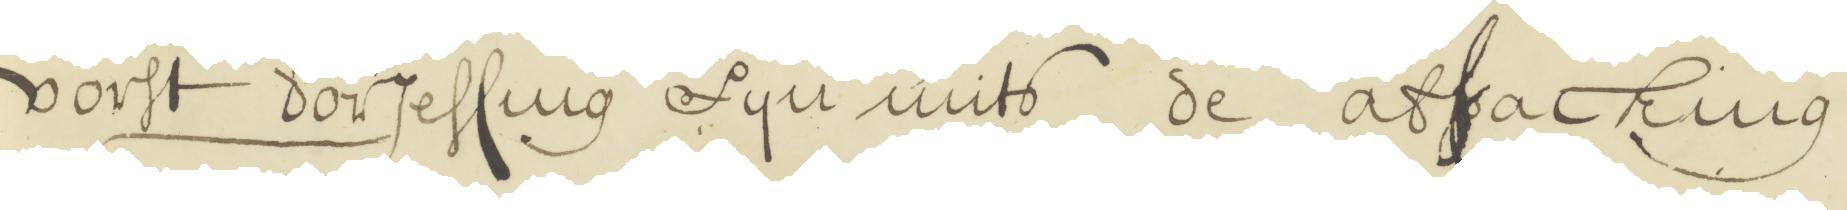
Vorst dorjessing syn mits de afsacking
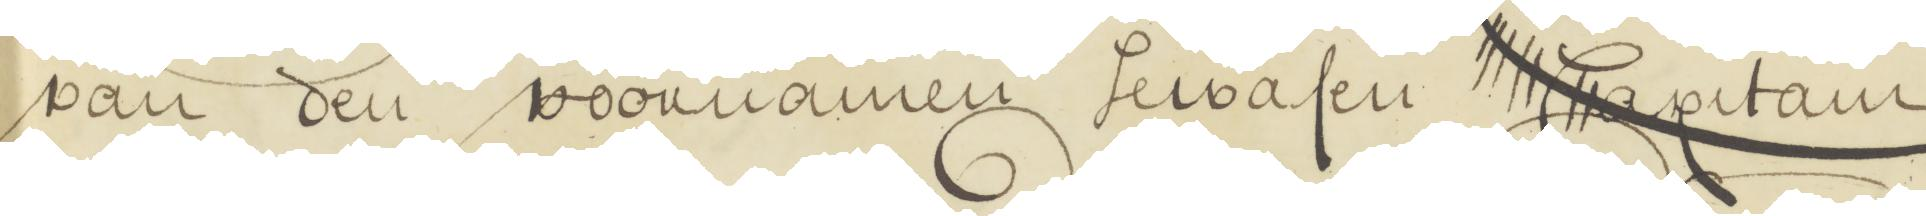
van den voornamen sewasen Capitain
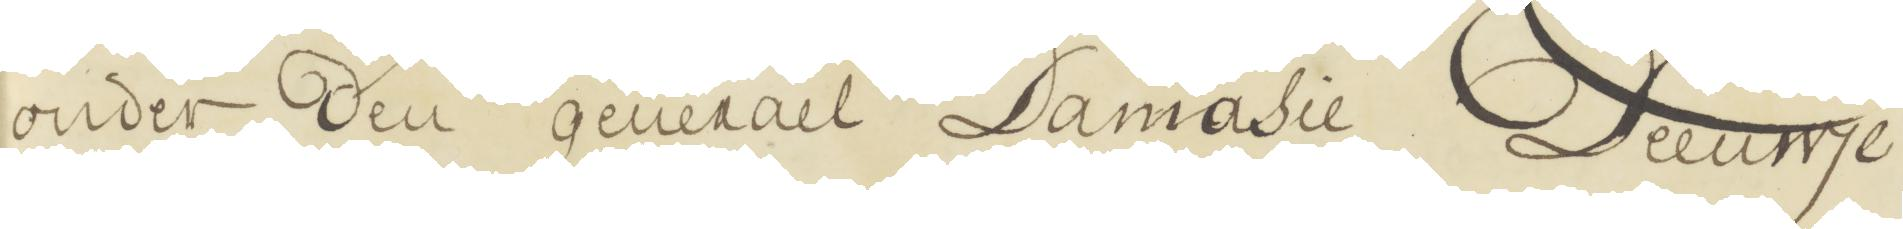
onder den generael Damahie Deenwje
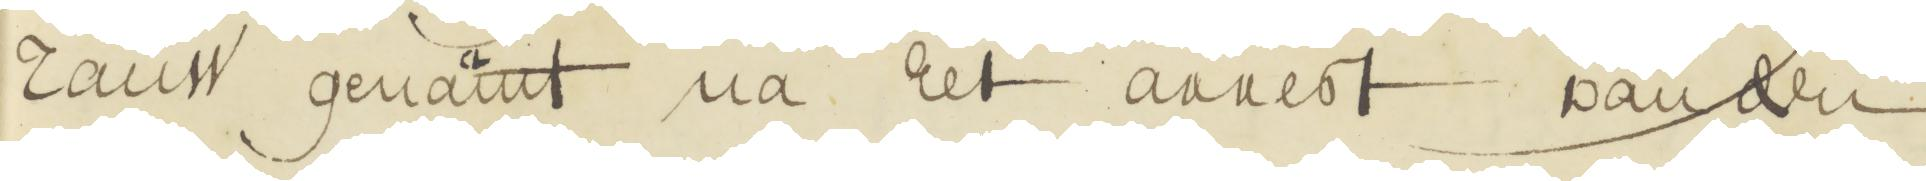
rauw genaamt na het arrest van den
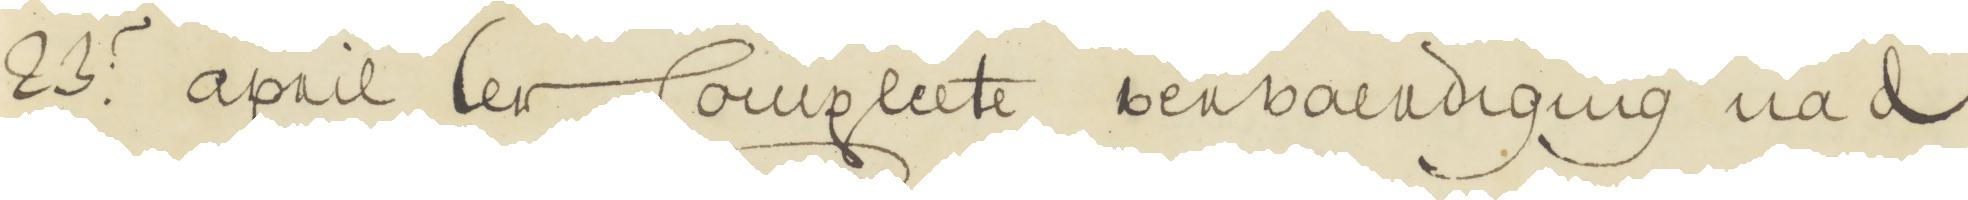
23:' april ter Compleete vervaerdiging na de
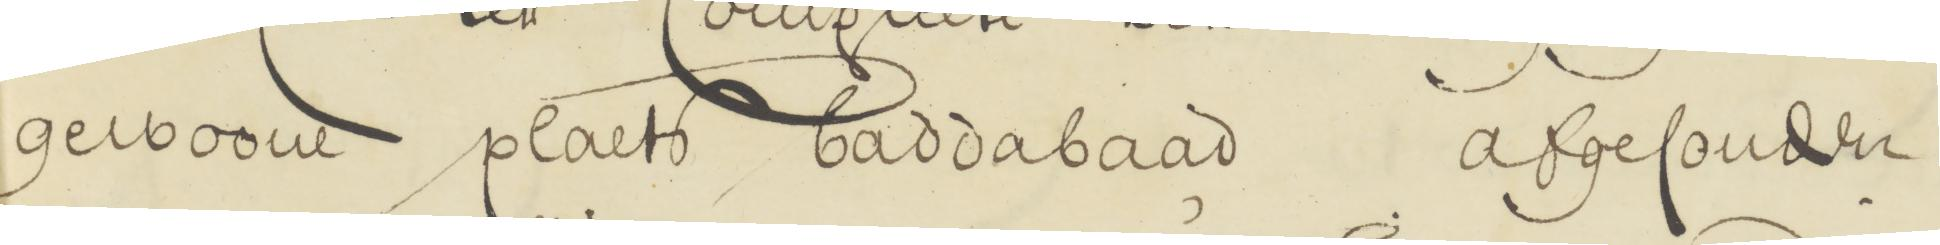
gewoone plaets baddabaad afgesonden
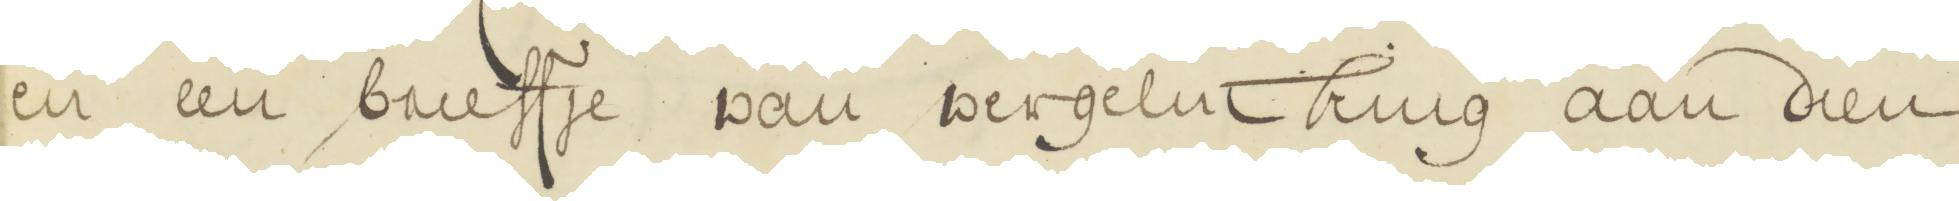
en een brieffje van vergelucking aan dien
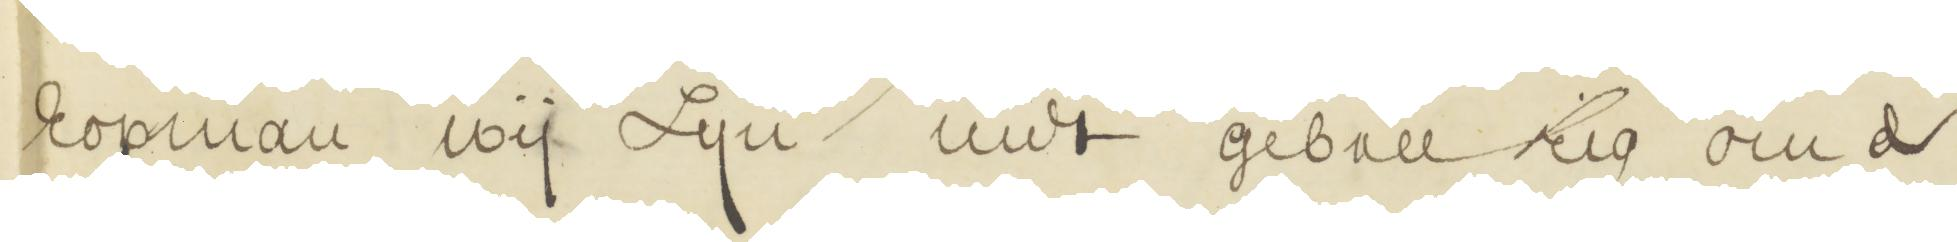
hopman wij sijn niet gebreekig om de
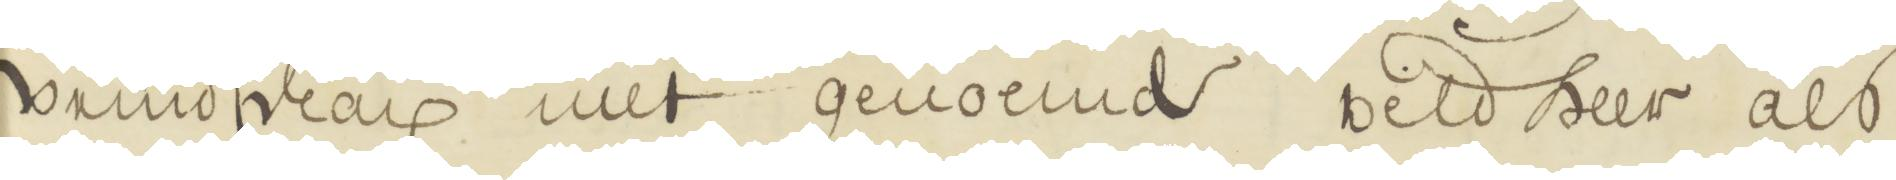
vrindschap met genoemde veld heer als
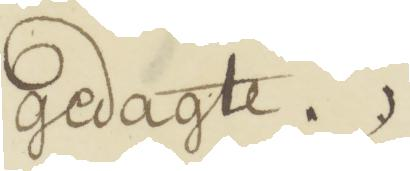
gedagte.
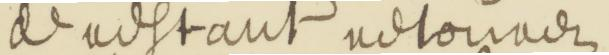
de restant retouren
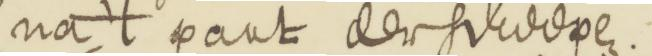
na ’t part derscheepen.
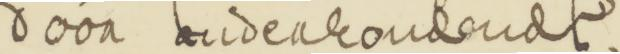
door onderhoudende
